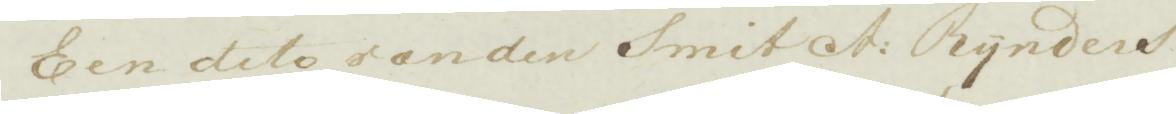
Een dito van den Smit A: Rijnders
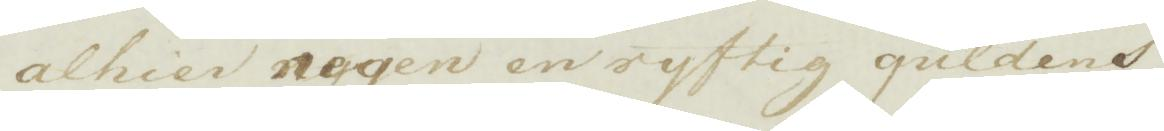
alhier negen en vyftig guldens
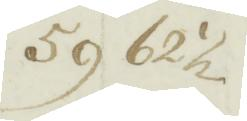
59 62½
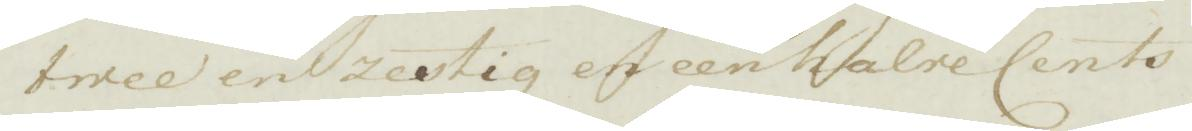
twee en zestig en een halve Cents - -
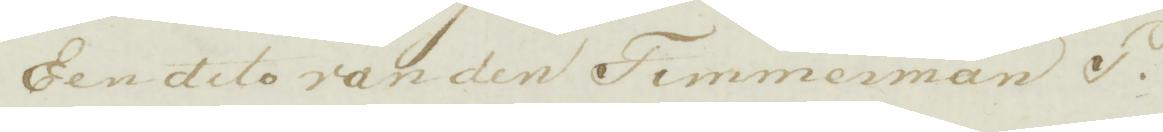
Een dito van den Timmerman T.
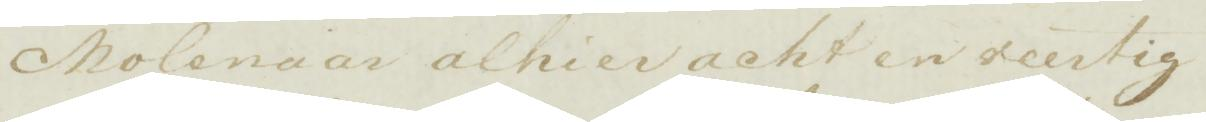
Molenaar alhier acht en veertig
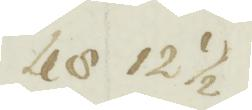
48 12½
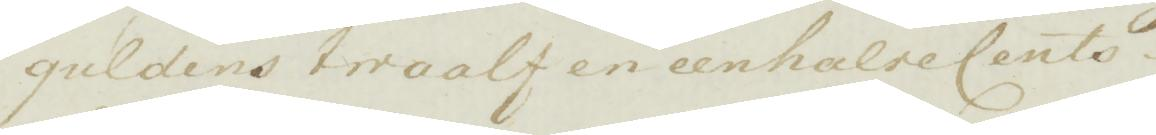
guldens twaalf en een halve Cents . .
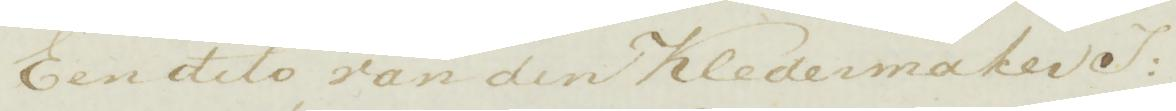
Een dito van den Kledermaker J:
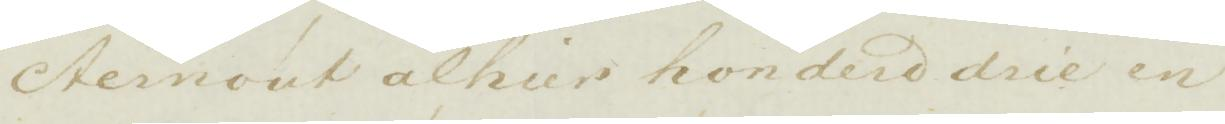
Aernout alhier honderd drie en
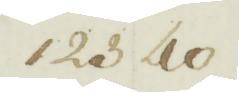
123 40
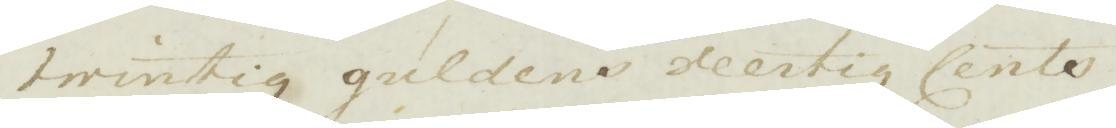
twintig guldens veertig Cents . . .
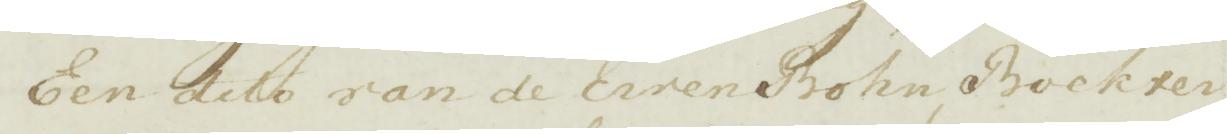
Een dito van de Erven Bohn, Boek ver
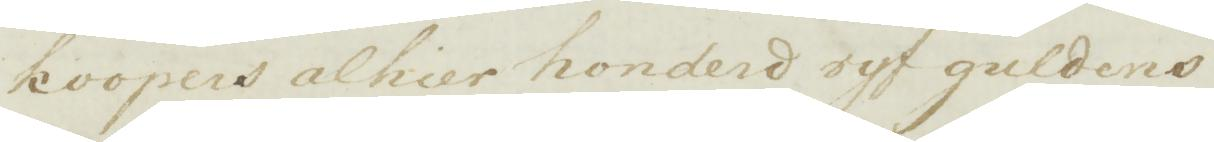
koopers alhier, honderd vyf guldens
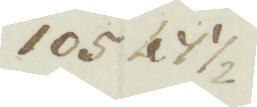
105 47½
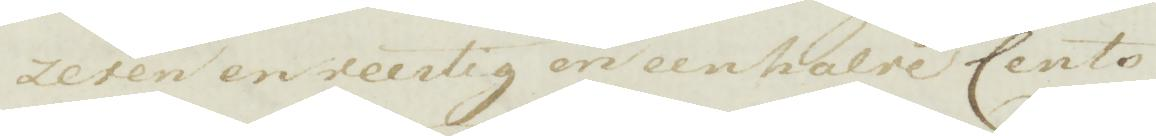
zeven en veertig en een halve Cents - -
